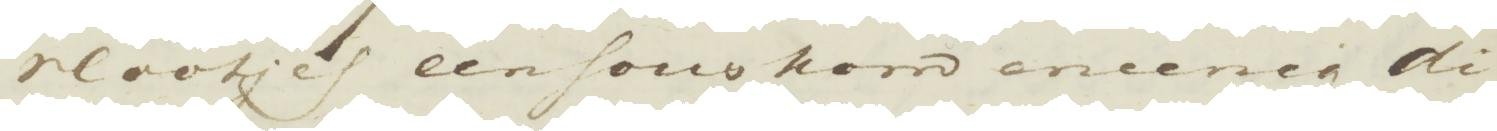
vlootjes een souskom en eenig di
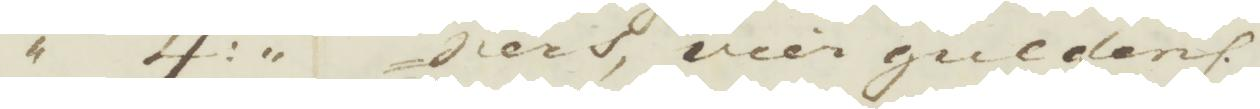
„ 4: „ =vers, vier guldens.
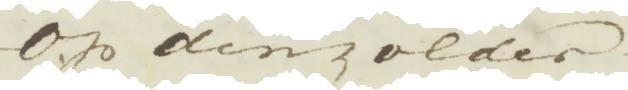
op den zolder
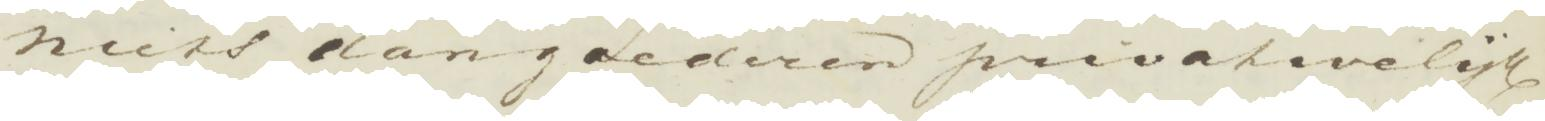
niets dan goederen privativelijk
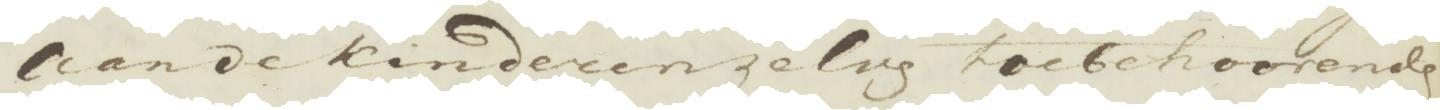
aan de kinderen zelve toebehoorenden
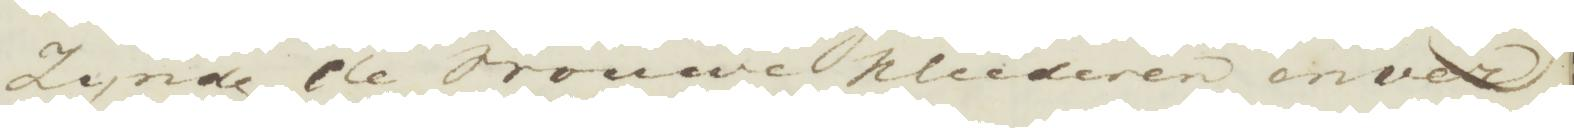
zynde de vrouwe kleederen en ver
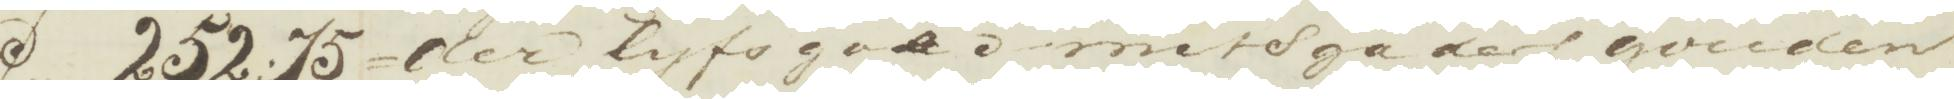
ƒ 252:75 =der lyfsgoed mitsgaders gouden
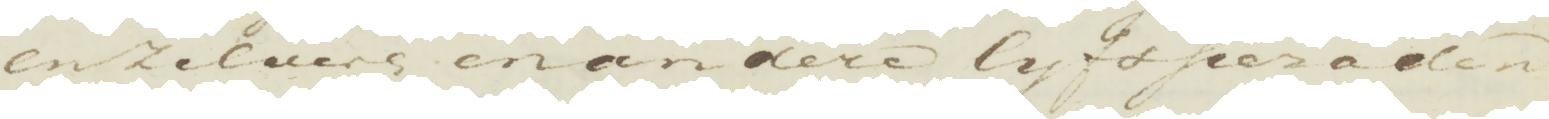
en zilveren en andere lyfssieraden
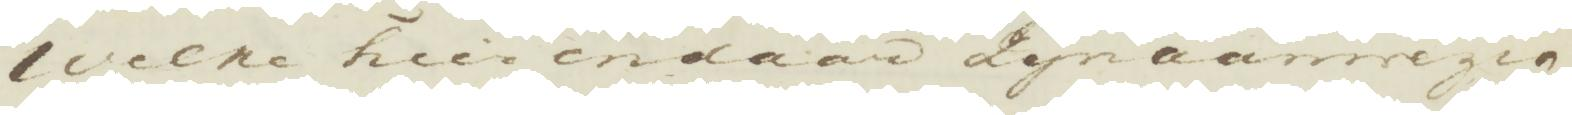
welke hier en daar zyn aanwezig
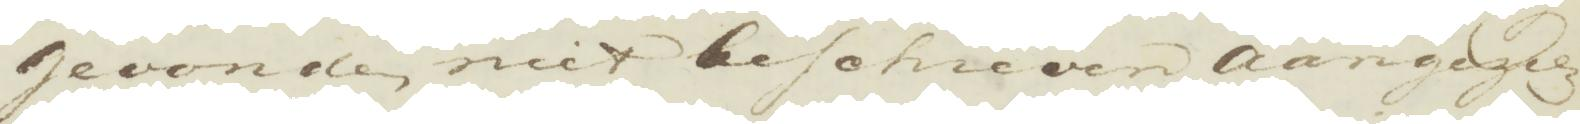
gevonden niet beschreven aangezien
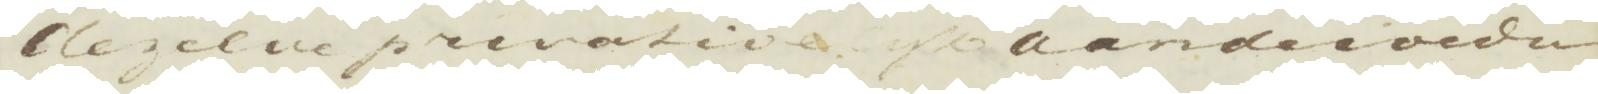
dezelve privativelyk aan de wedu
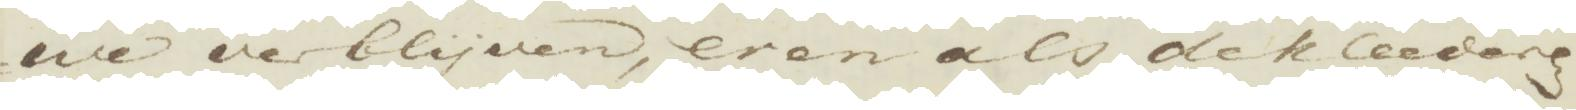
we verblijven, even als de kleederen
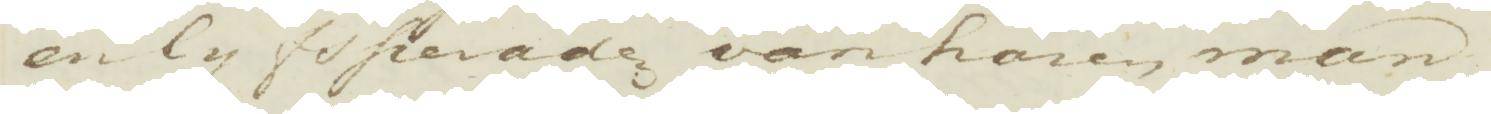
en lyfssieraden van haren man
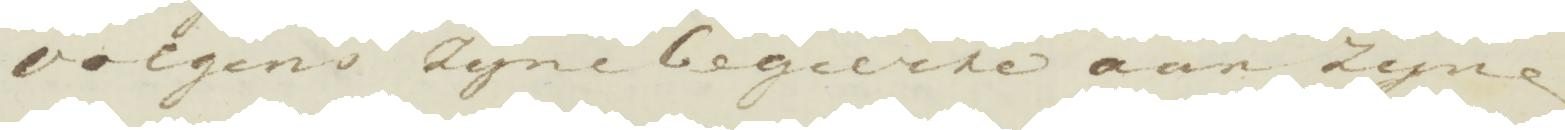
volgens zyne begeerte aan zyne
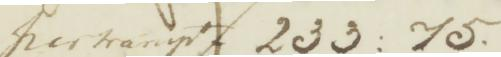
Per transpt ƒ 233: 75.
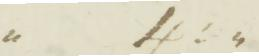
„ 4: „
